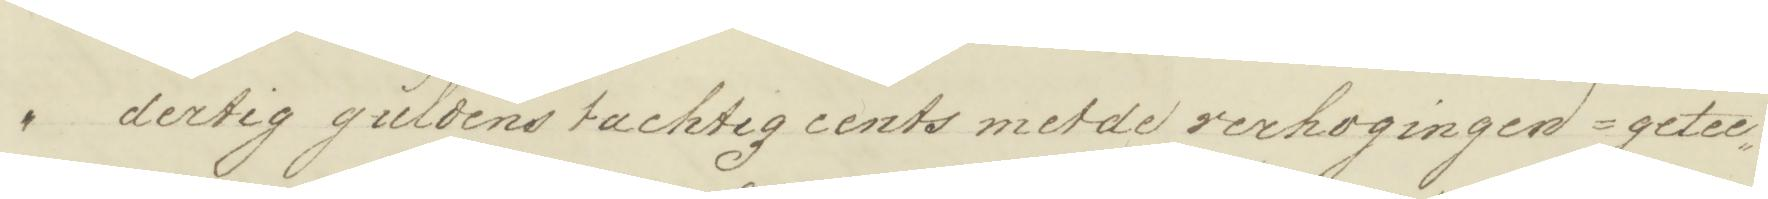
„ dertig guldens tachtig cents met de verhogingen =getee„
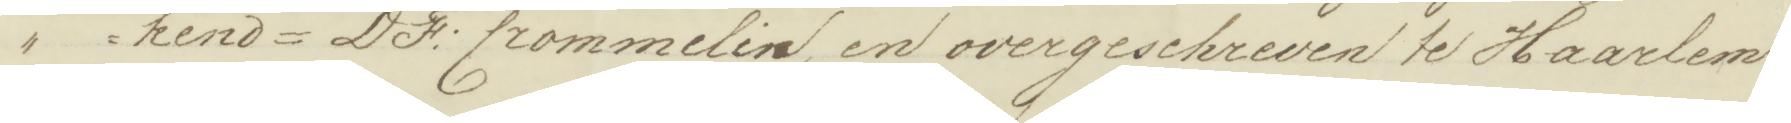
„ =kend = D F: Crommelin, en overgeschreven te Haarlem
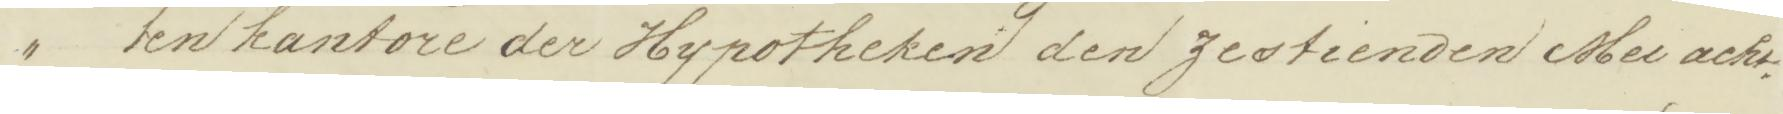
„ ten kantore der Hypotheken den zestienden Mei acht„
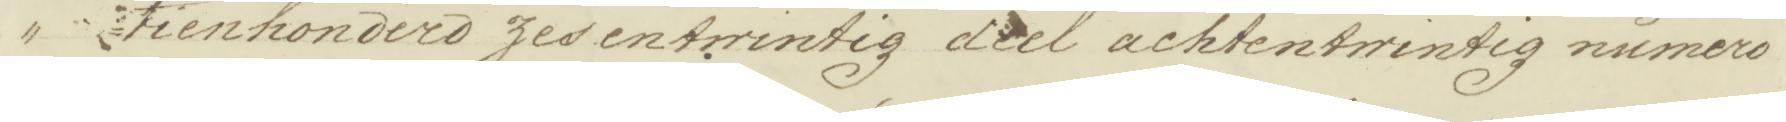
„ =tienhonderd zes en twintig deel achtentwintig numero
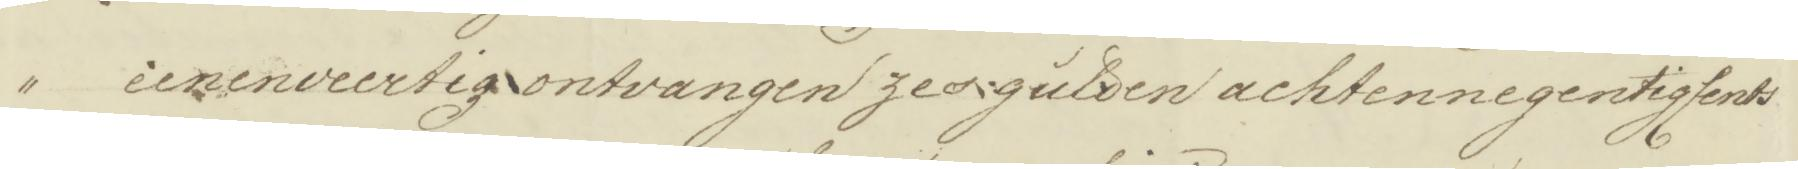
„ eenenveertig ontvangen zes gulden achtennegentig Cents
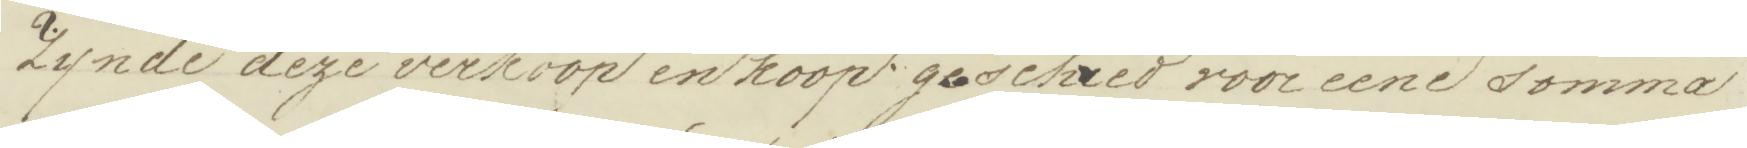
zynde deze verkoop en koop geschied voor eene somma
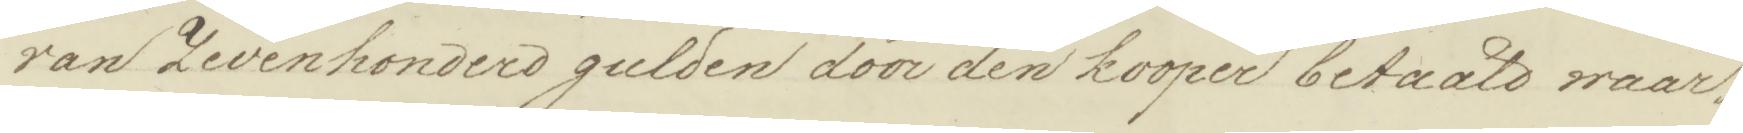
van zevenhonderd gulden door den kooper betaald waar„
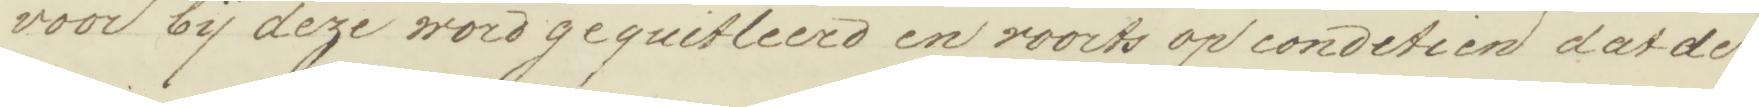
voor bij deze word gequitteerd en voorts op conditien dat de
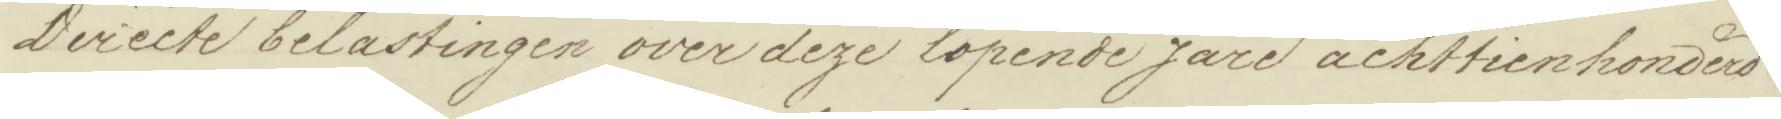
Directe belastingen over deze lopende Jare achttienhonderd
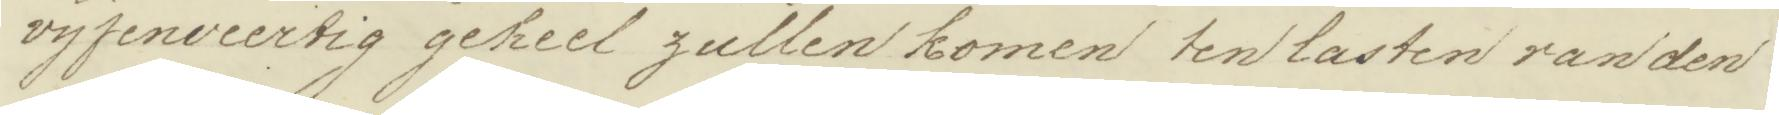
vijfenveertig geheel zullen komen ten lasten van den
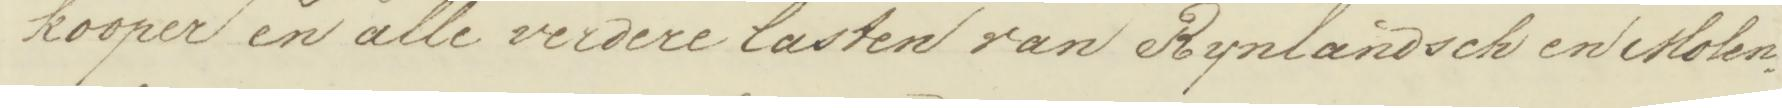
kooper en alle verdere lasten van Rynlandsch en Molen„
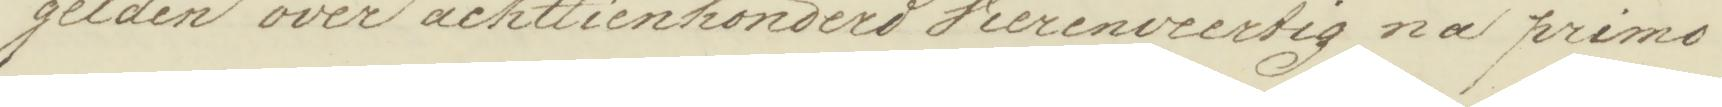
gelden over achttienhonderd Vierenveertig na primo
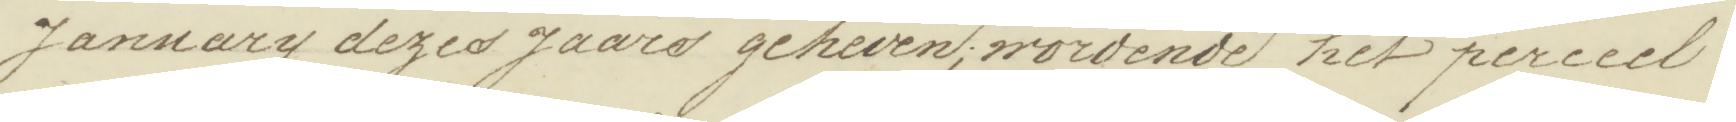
January dezes Jaars geheven; wordende het perceel
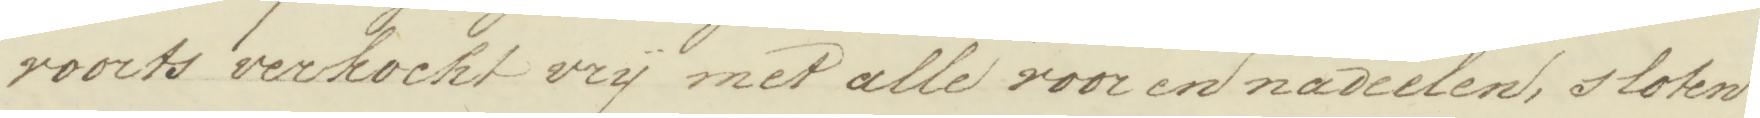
voorts verkocht vrij met alle voor en nadeelen, sloten
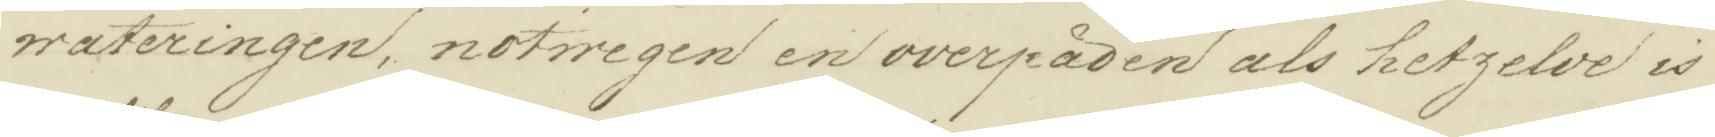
wateringen, notwegen en overpaden als hetzelve is
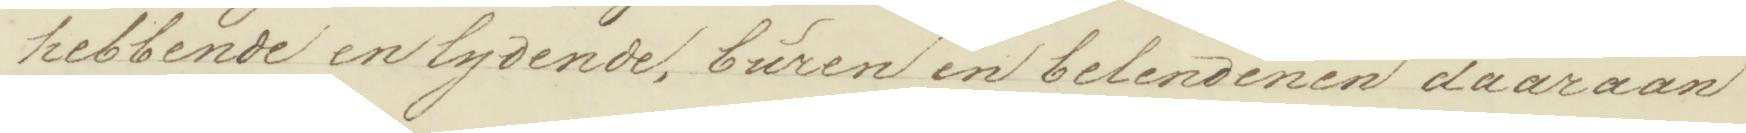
hebbende en lydende, buren en belendenen daar aan
